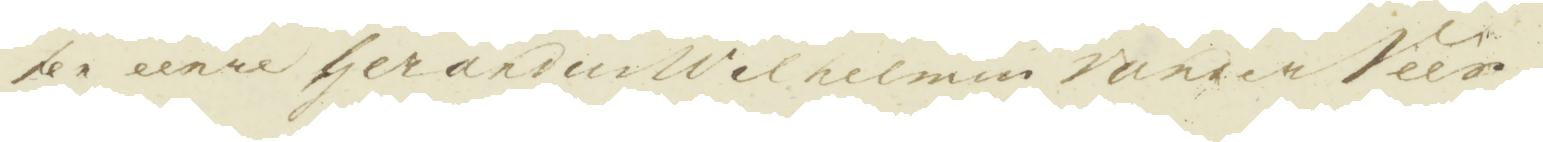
ter eenre Gerardus Wilhelmus vander Veer,
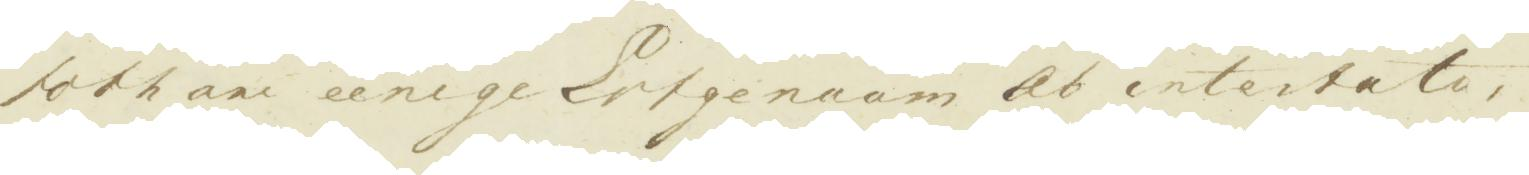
tot hare eenige Erfgenaam ab intestato,
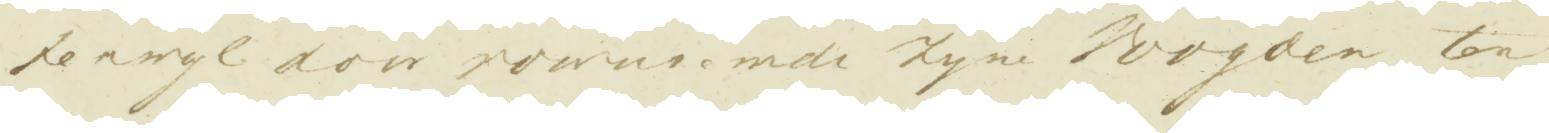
terwyl door voornoemde zyne Voogden ten
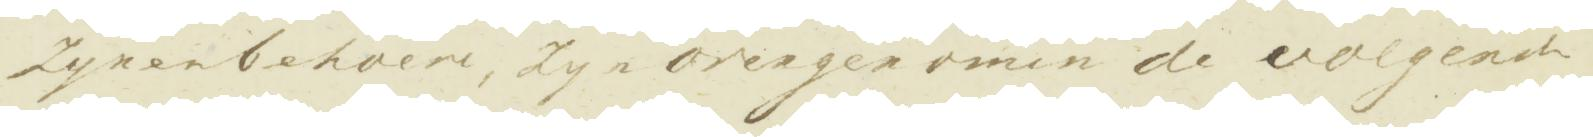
zynen behoeve, zyn overgenomen de volgende
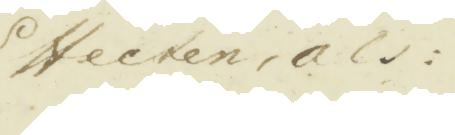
ffecten, als:
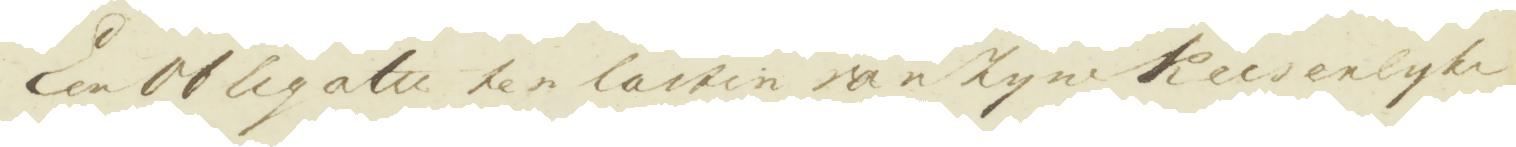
Een obligatie ten lasten van Zyne Keiserlyke
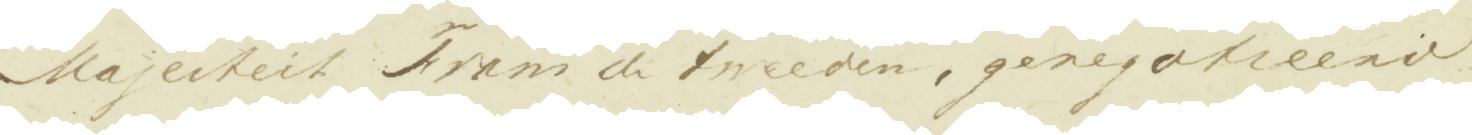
Majesteit Frans de tweeden, genegotieerd
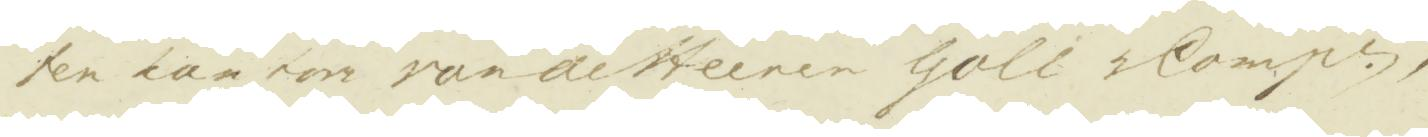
ten kantore van de Heeren Goll en Comp.s,
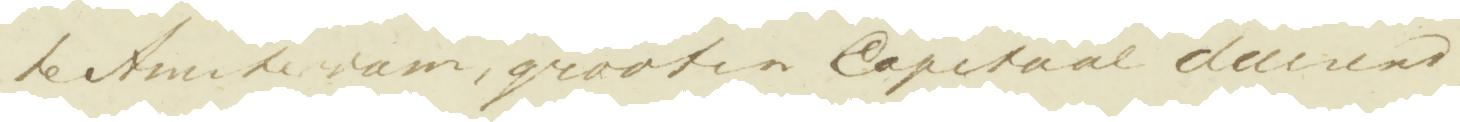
te Amsterdam, groot in Capitaal duizend
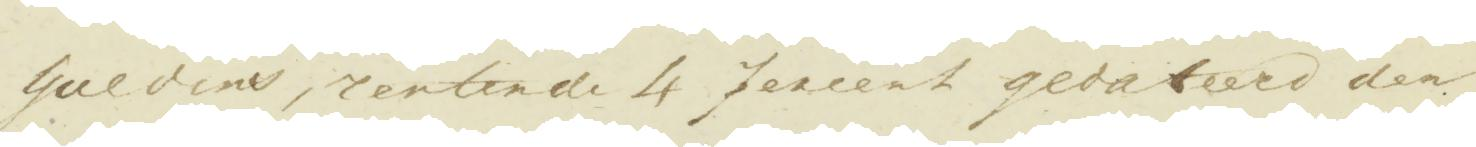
guldens, rentende 4 percent gedateerd den
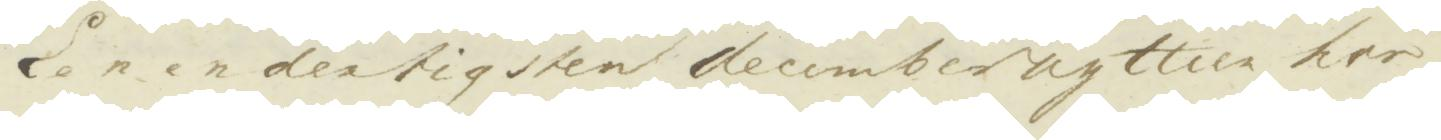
Een en dertigsten december agttien hon
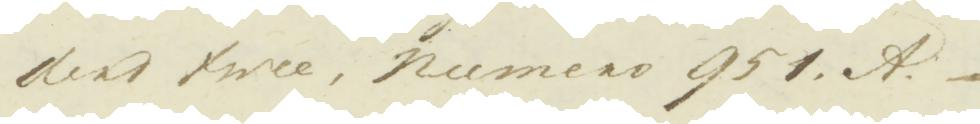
dert twee, numero 951.A.-
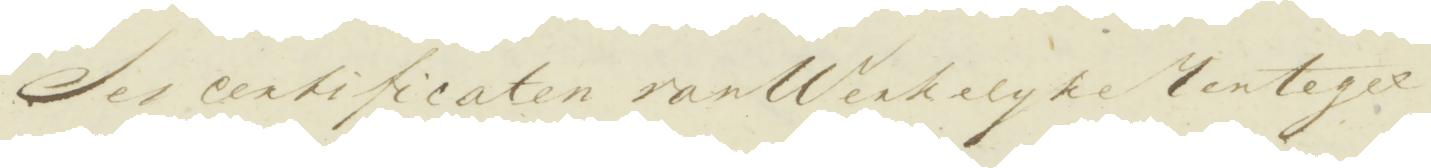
Ses certificaten van Werkelyke Rentege x
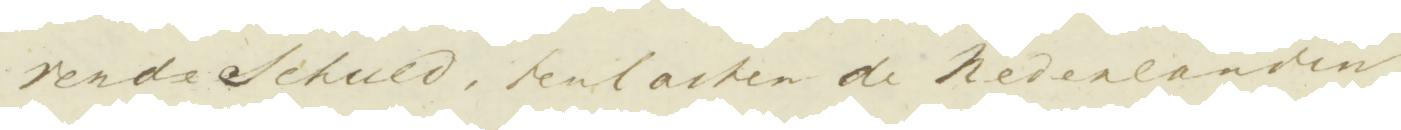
vende Schuld, ten lasten de Nederlanden
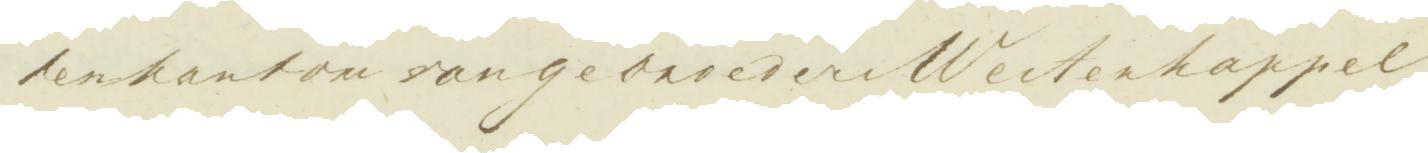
ten kantore van gebroeders Weiterkappel
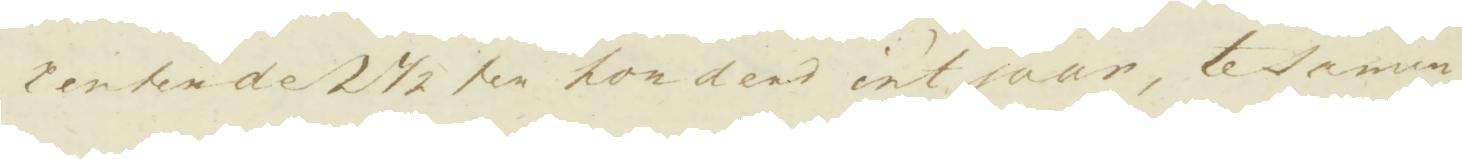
rentende 2½ te honderd in't jaar, te samen
